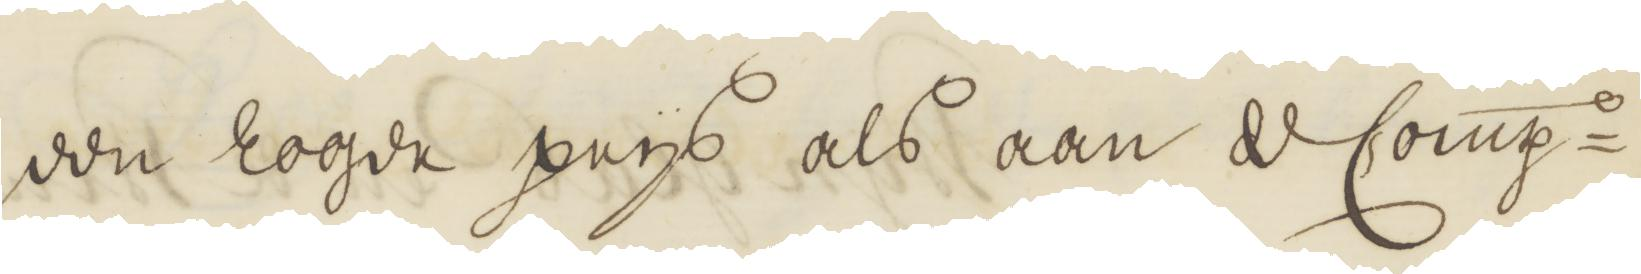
een hoger prijs als aan de Comp=e
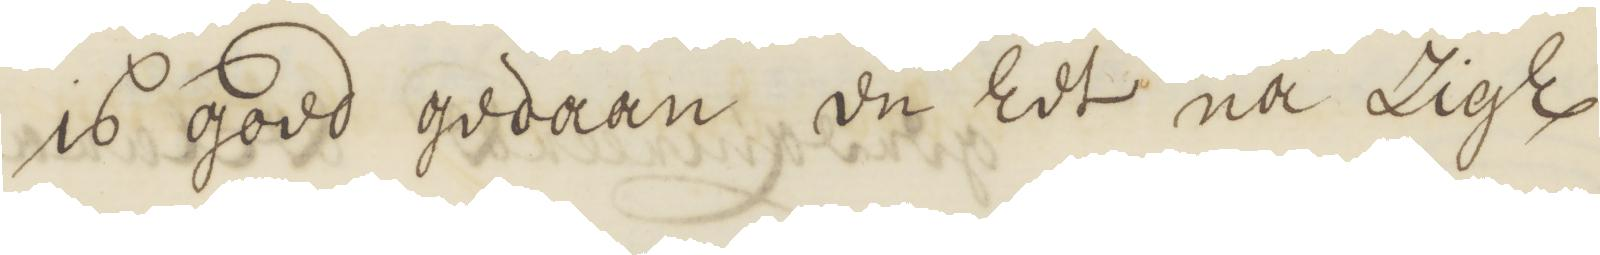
is goed gedaan en het na Zigh
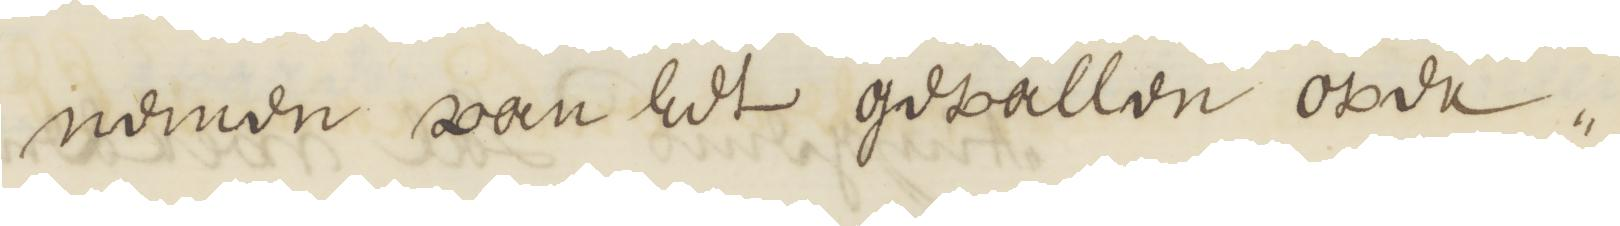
nemen van het gevallen over„
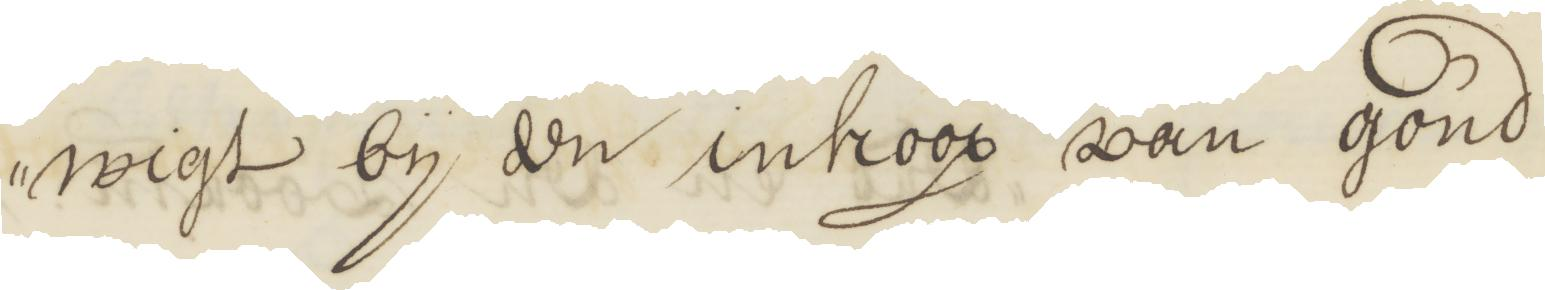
„wigt bij den inkoop van goud
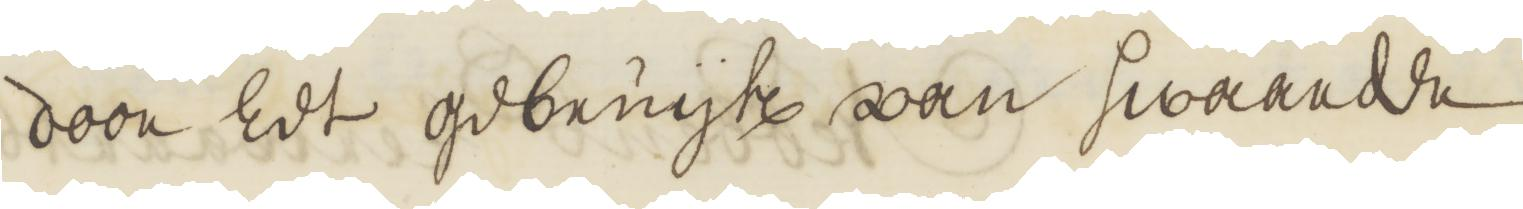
door het gebruijk van swaarder
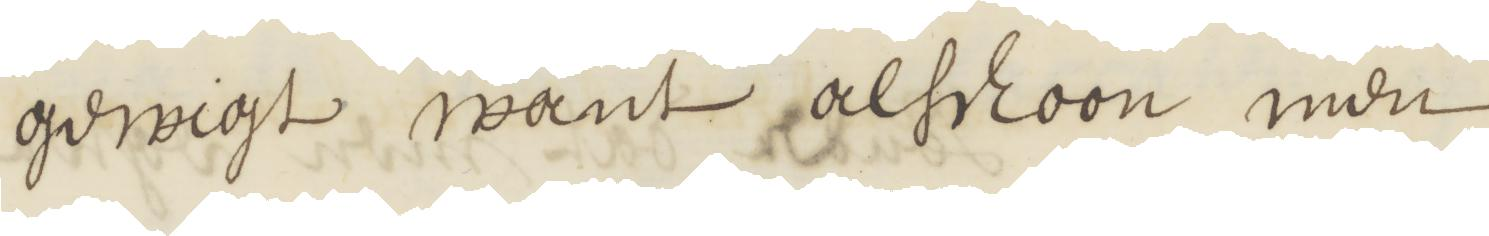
gewigt want alschoon men
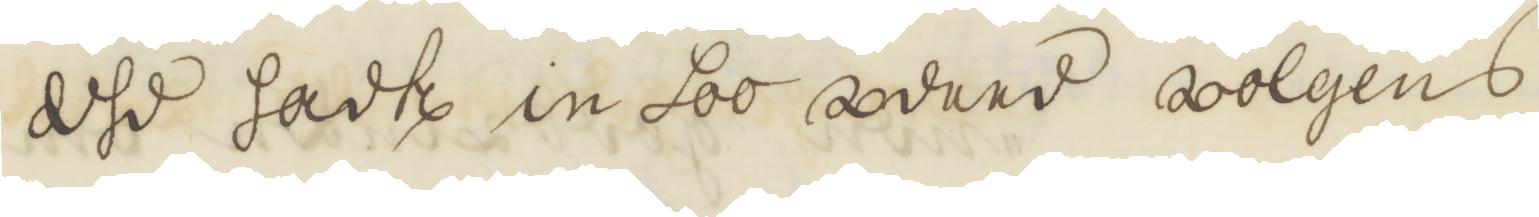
dese saek in soo verre volgens
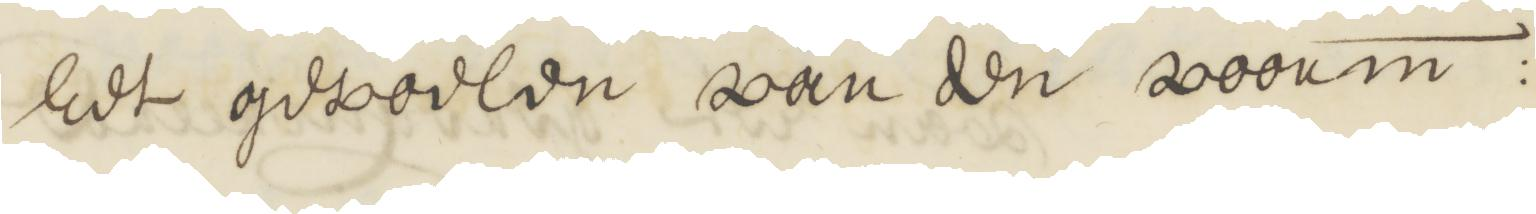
het gevoelen van den voorm:
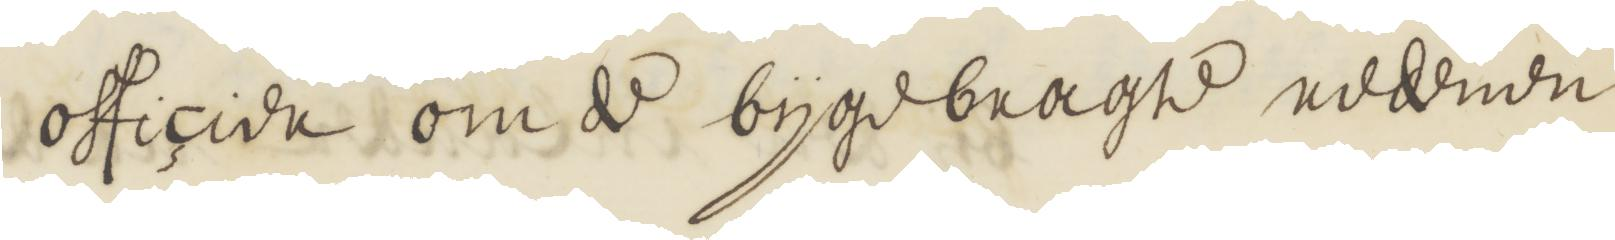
offiçier om de bijgebragte redenen
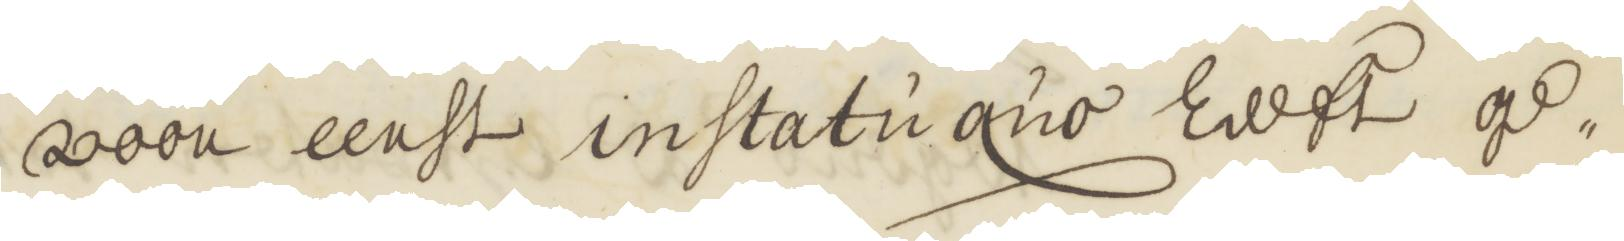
voor eerst instatu quo heeft ge„
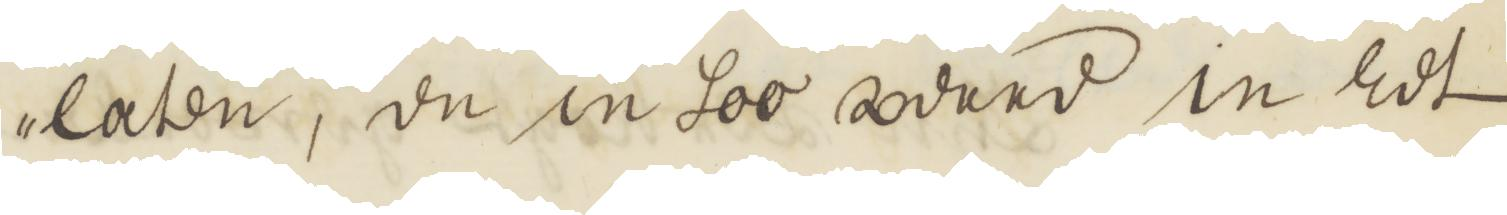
„laten, en in soo verre in het
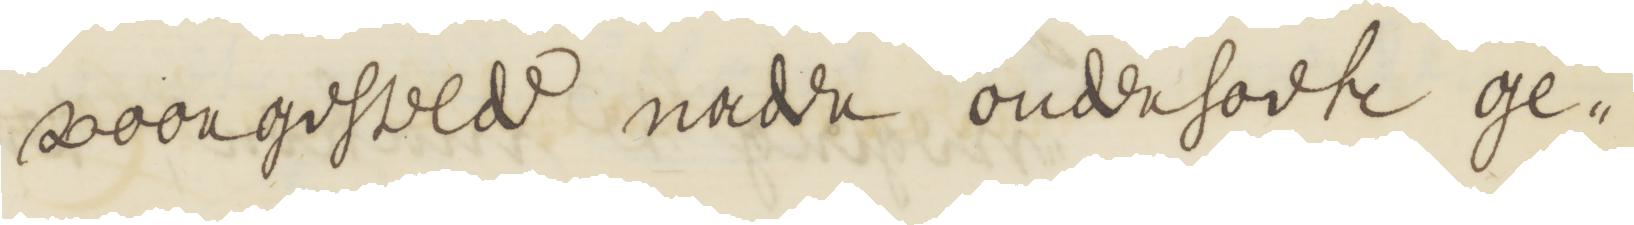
voorgestelde nader ondersoek ge„
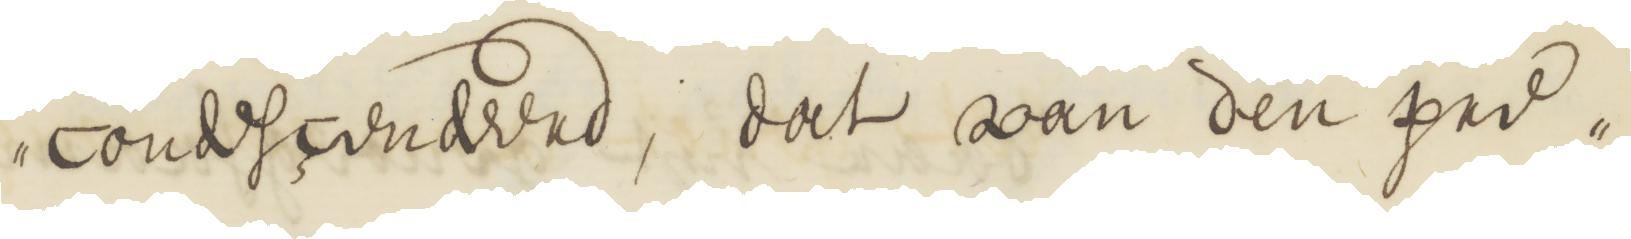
„condesçendeerd; dat van den pre„
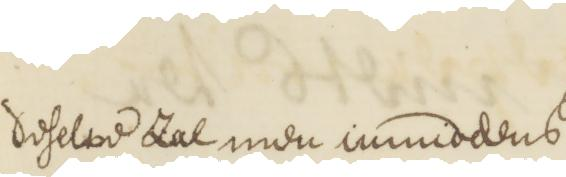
deselve Zal men inmiddens
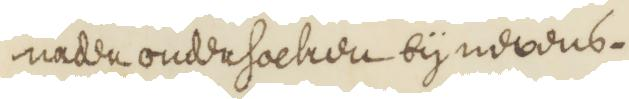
nader ondersoeken bij nevens
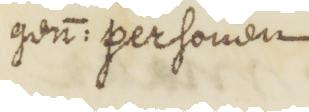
gen: personen
